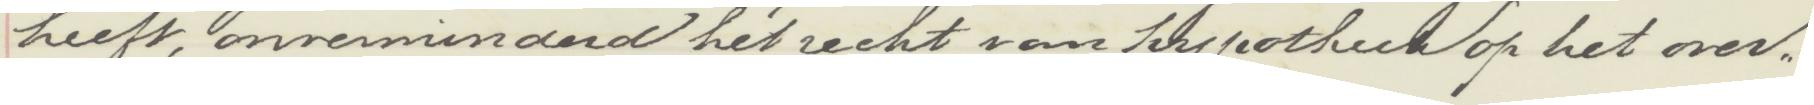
heeft, onverminderd het recht van hypotheek op het over„
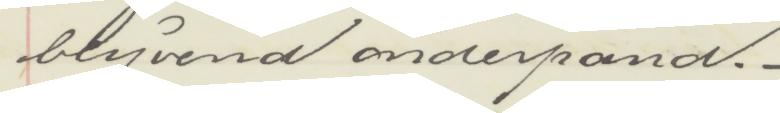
blijvend onderpand.
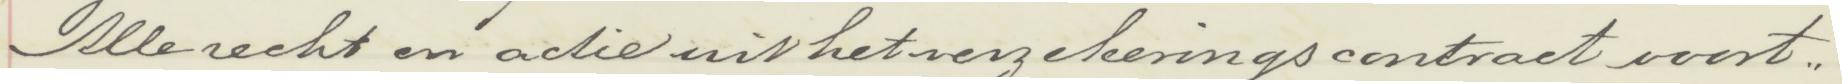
Alle recht en actie uit het verzekerings contract voort„
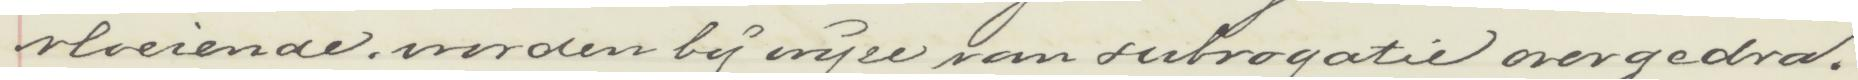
vloeiende, worden bij wijze van subrogatie overgedra„
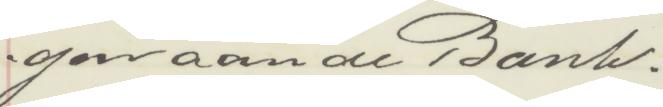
gen aan de Bank.
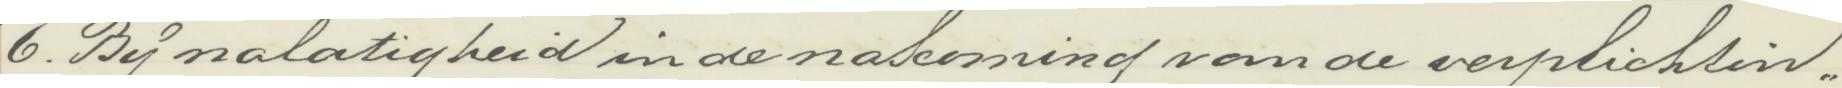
6. Bij nalatigheid in de nakoming van de verplichtin„
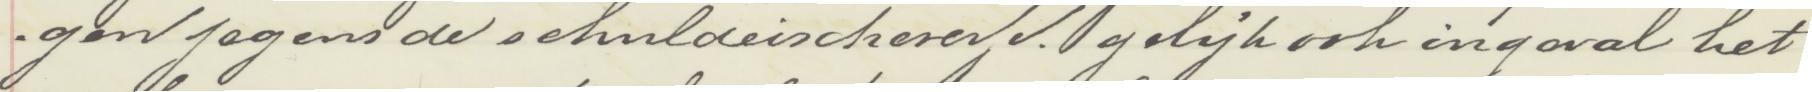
„gen jegens de schuldeischeress. gelijk ook ingeval het
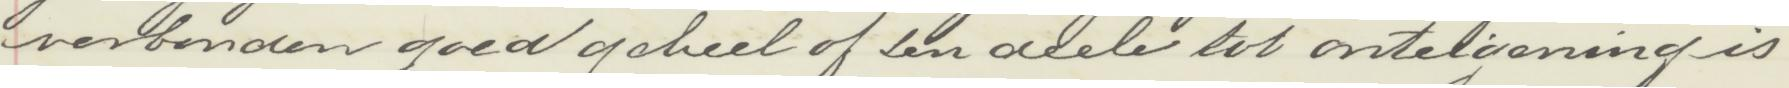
verbonden goed geheel of ten deele tot onteigening is
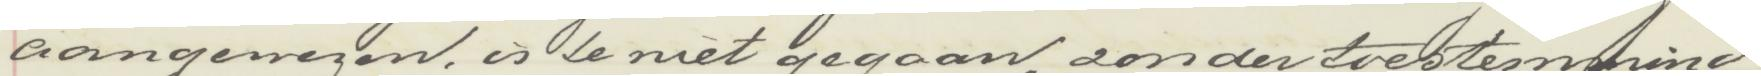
aangewezen, is te niet gegaan, zonder toestemming
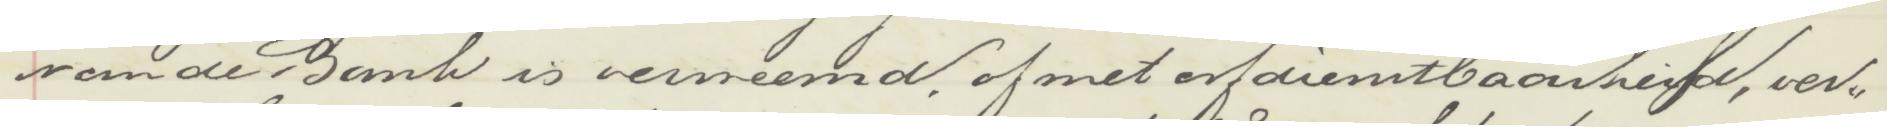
van de Bank is vervreemd, of met erfdienstbaarheid, ver„
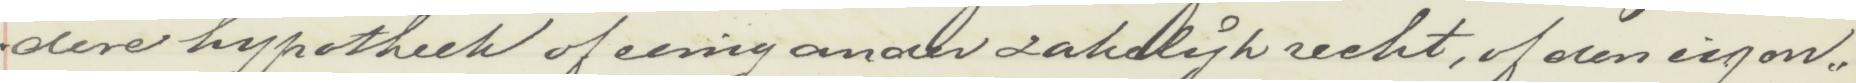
dere hypotheek of eenig ander zakelijk recht, of den eigen„
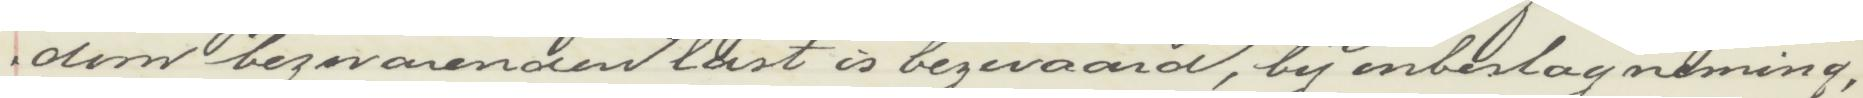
„dom bezwarenden last is bezwaard, bij inbeslagneming,
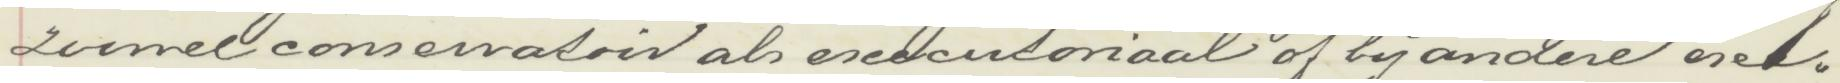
zoowel conservatoir als executoriaal of bij andere exe„
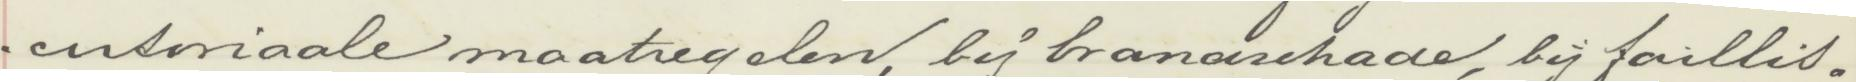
„cutoriaale maatregelen, bij brandschade, bij faillis„
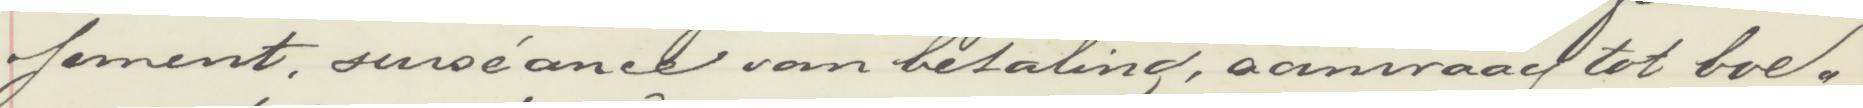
sement, surseance van betaling, aanvraag tot boe„
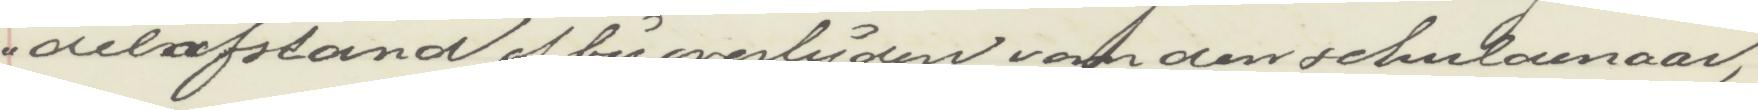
„delafstand of bij overlijden van den schuldenaar,
